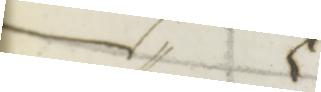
_„o 5
